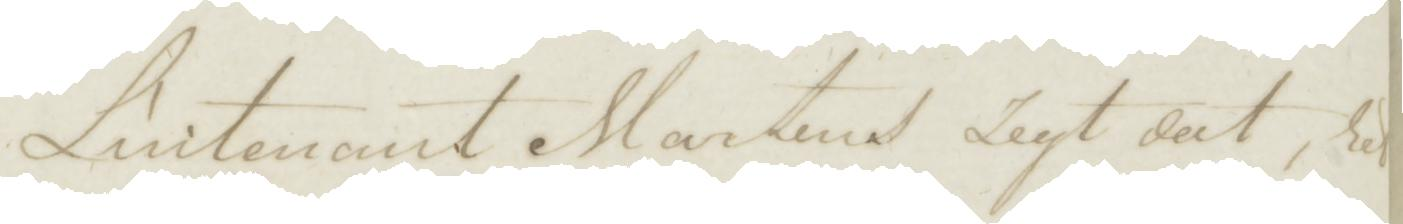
Luitenant Martens zegt dat, het
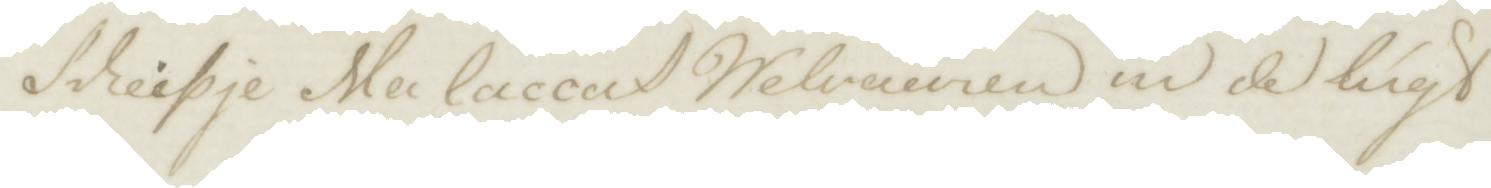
Scheepje Malaccas Welvaaren in de lugd
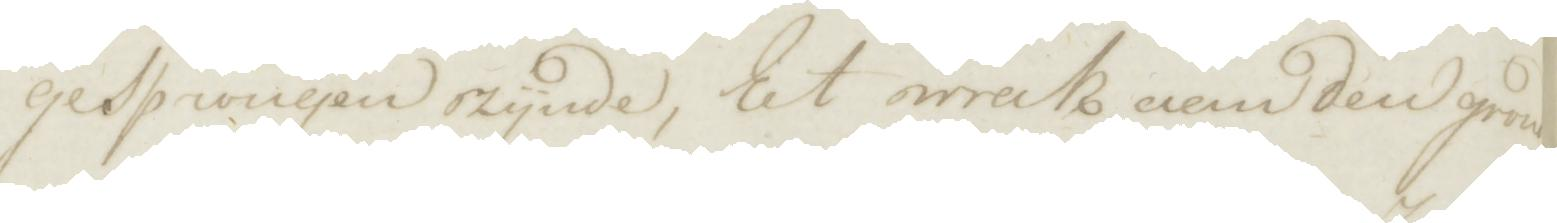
gesprongen zijnde, het wrak aan den grond
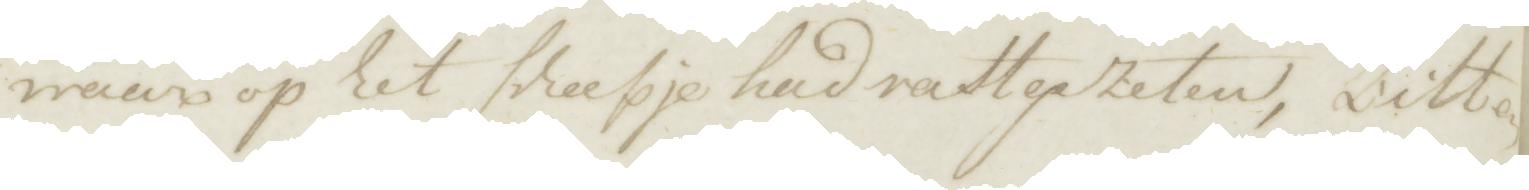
waar op het Scheepje had vastgezeten, Zitten
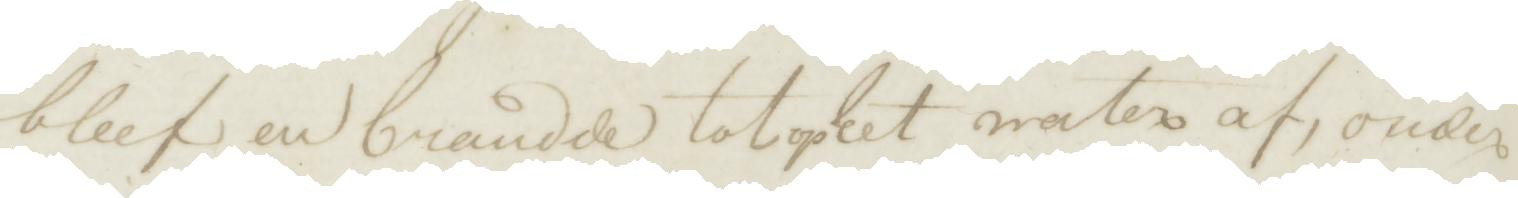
bleef en brandde tot op het water af, onder
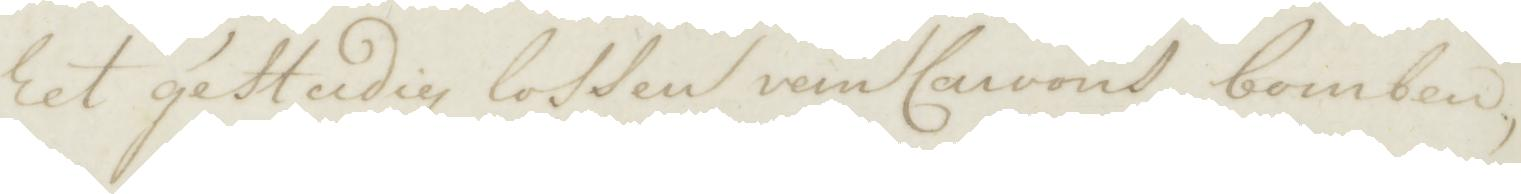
het gestadig lossen van Canons, bomben
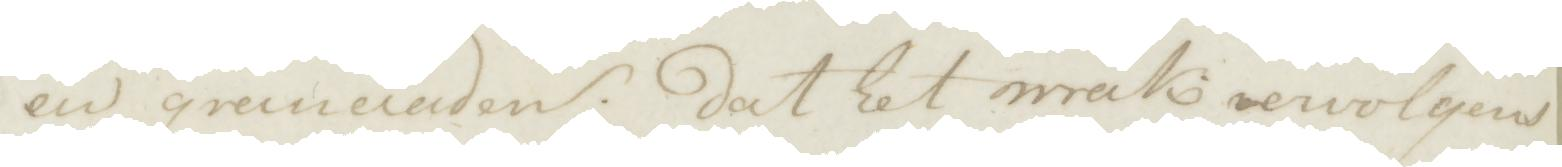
en granaaden. dat het wrak vervolgens
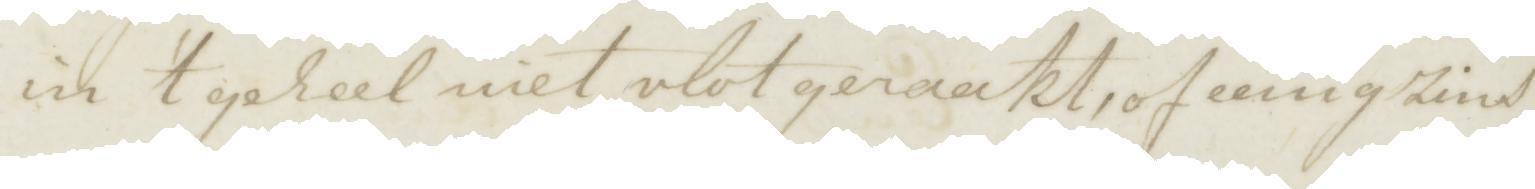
in ’t geheel niet vlotgeraakt, of eenigzins
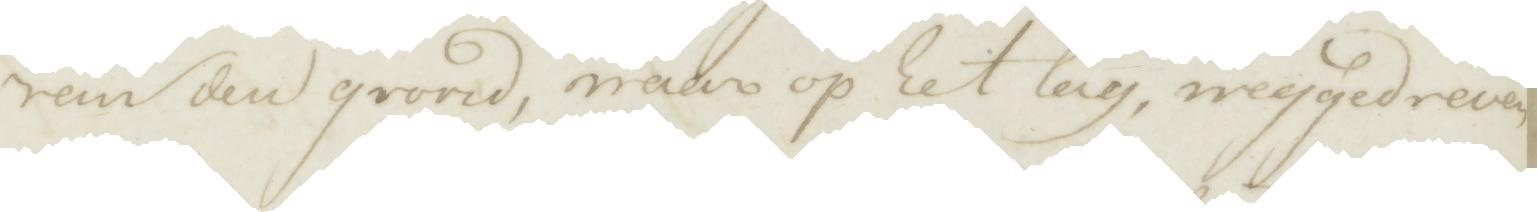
van den grond, waar op het lag, weggedreven
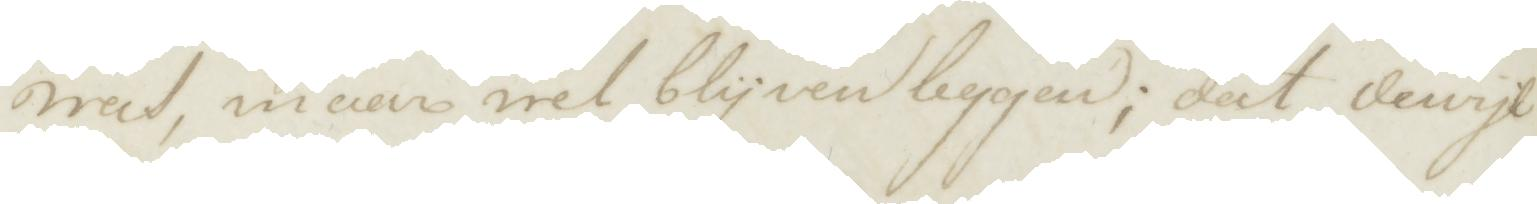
was, maar wel blijven leggen; dat dewijl
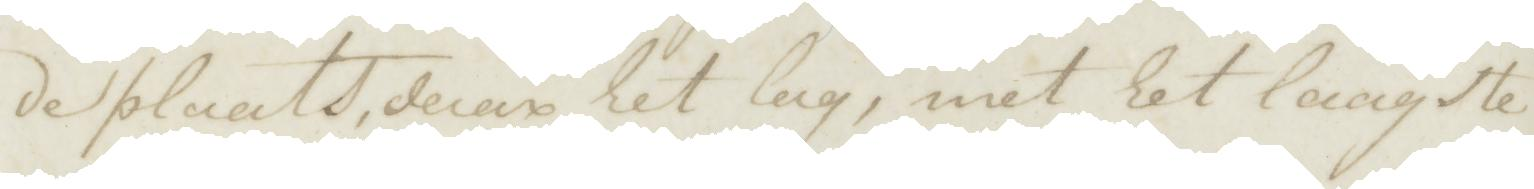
de plaats, daar het lag, met het laagste
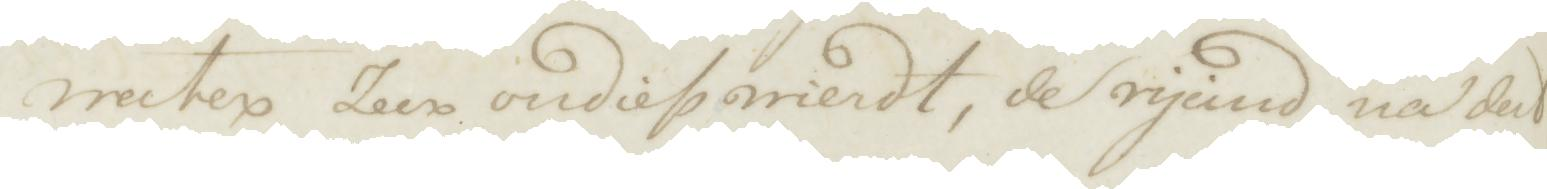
water Zeer ondiep wierdt, de vijand na dat
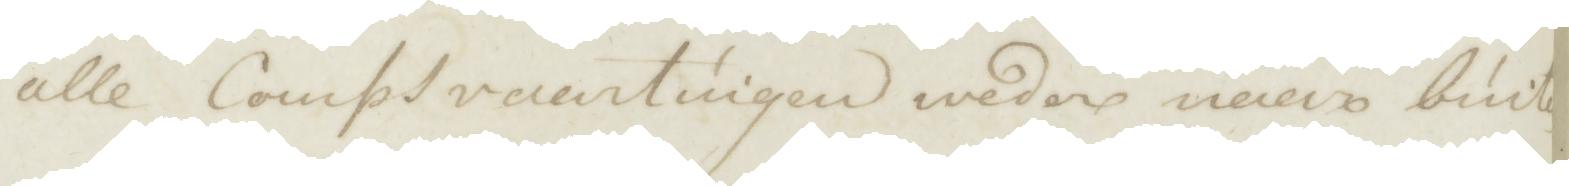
alle Comps vaartuigen weder naar buit
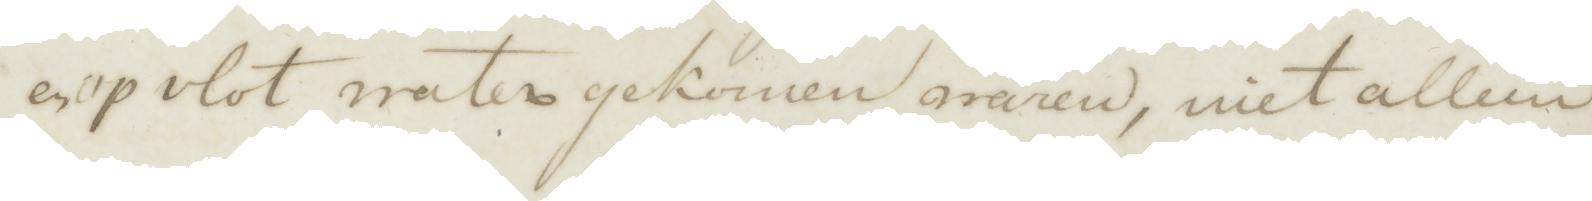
en op vlot water gekomen waren, niet alleen
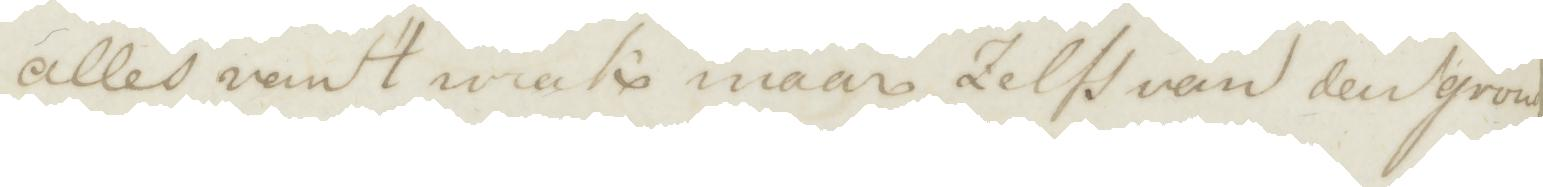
alles van ’t wrak maar Zelfs van den grond,
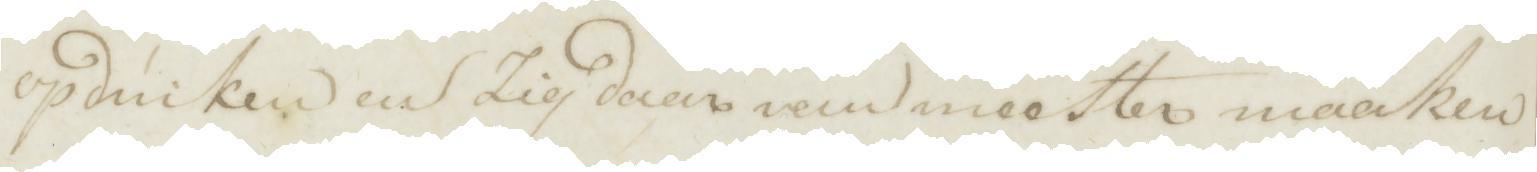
opduiken en Zig daar van meester maaken
